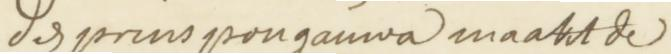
den prins pongauwa maakt de
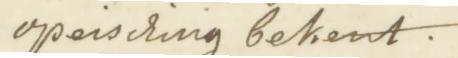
opeisching bekent.
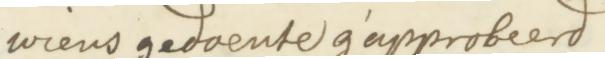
wiens gedoente g' approbeerd
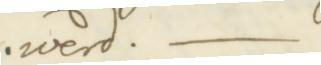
werd. —
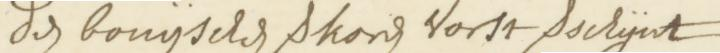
den bonijschen verkoren vorst verschijnt
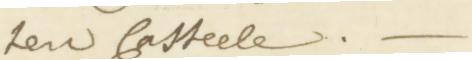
ten Casteele. —
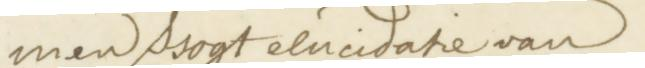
men versogt elucidatie van
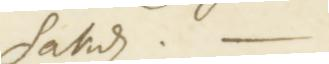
saken. —
